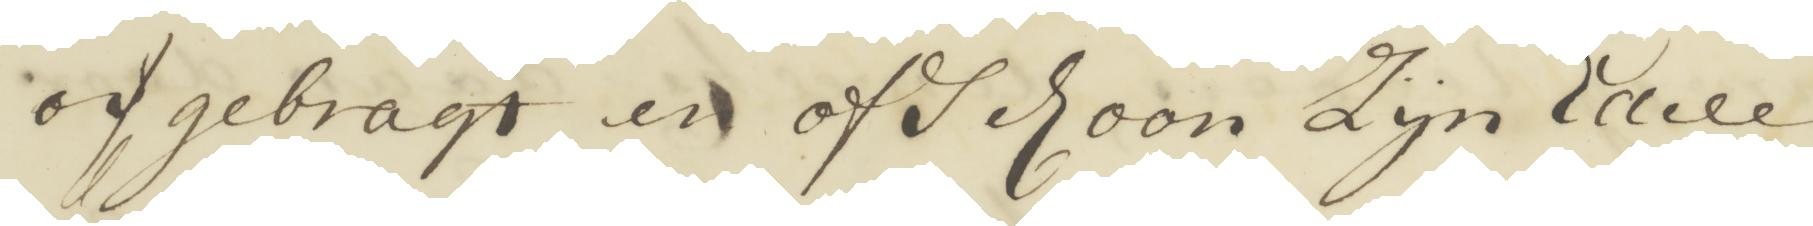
overgebragt, en of schoon zijn Edele
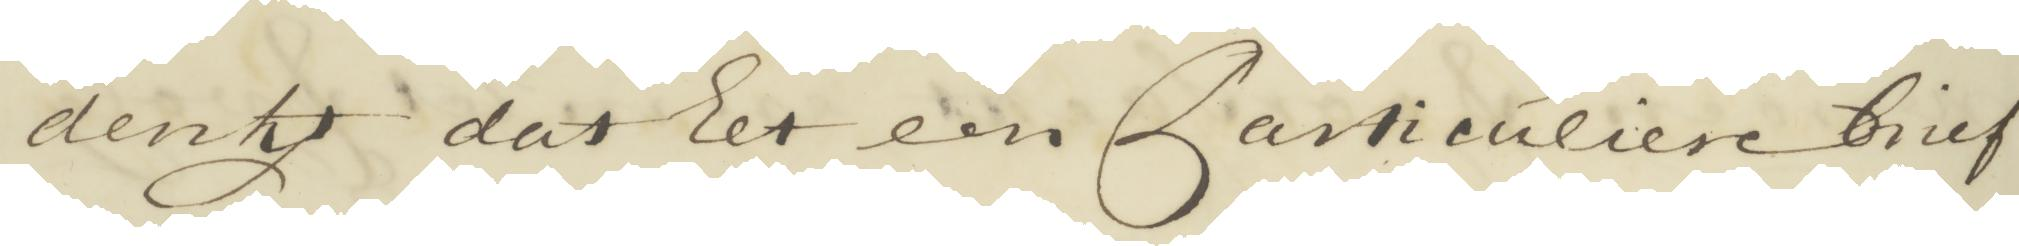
denkt dat het een Particuliere brief
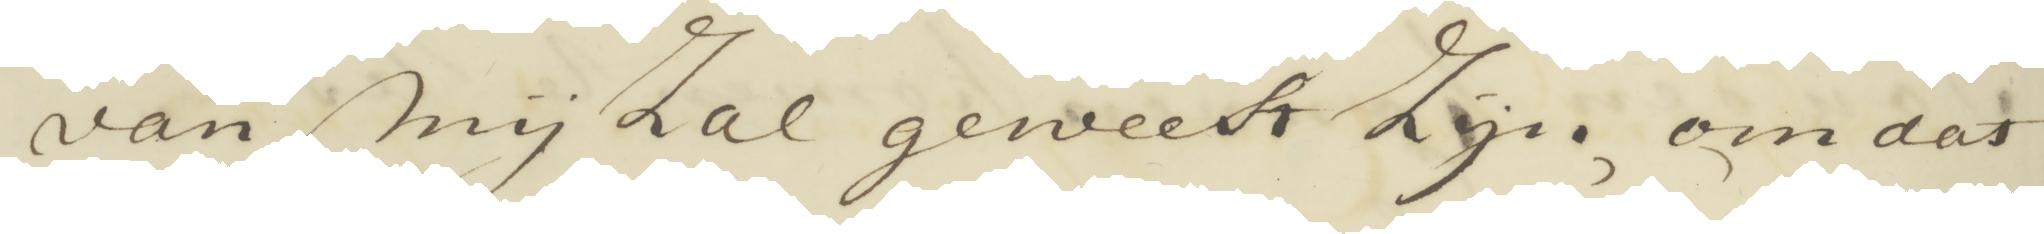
van mij zal geweest zijn, om dat
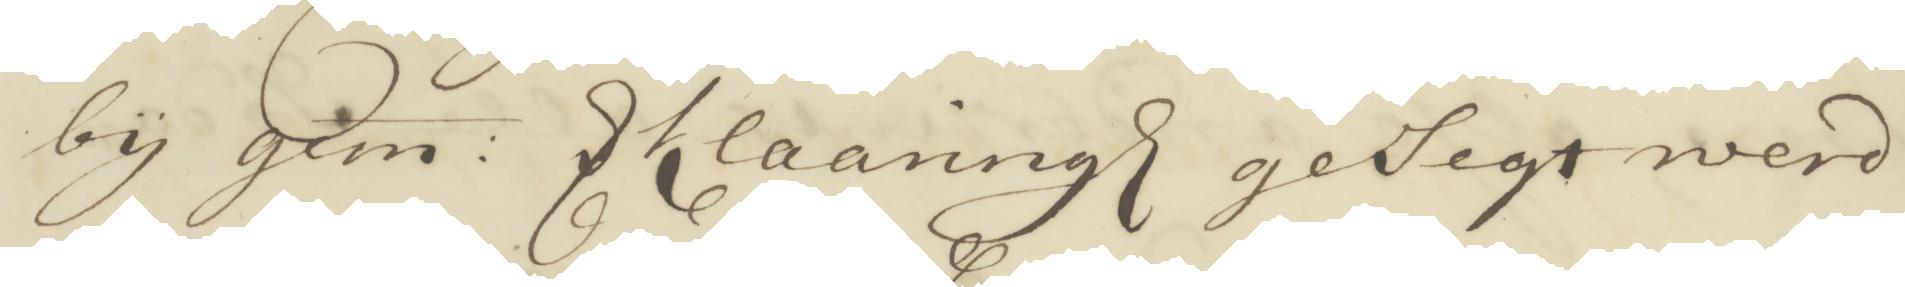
bij gem: verklaaringh gesegt werd
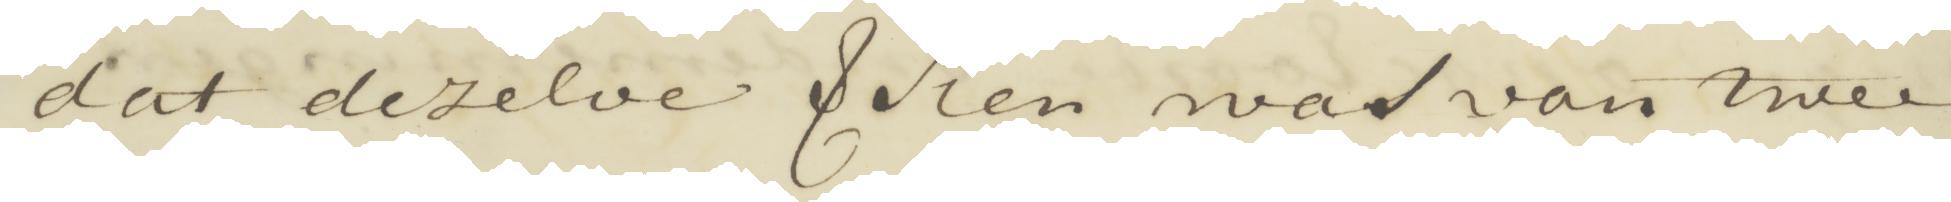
dat dezelve versien was van twee
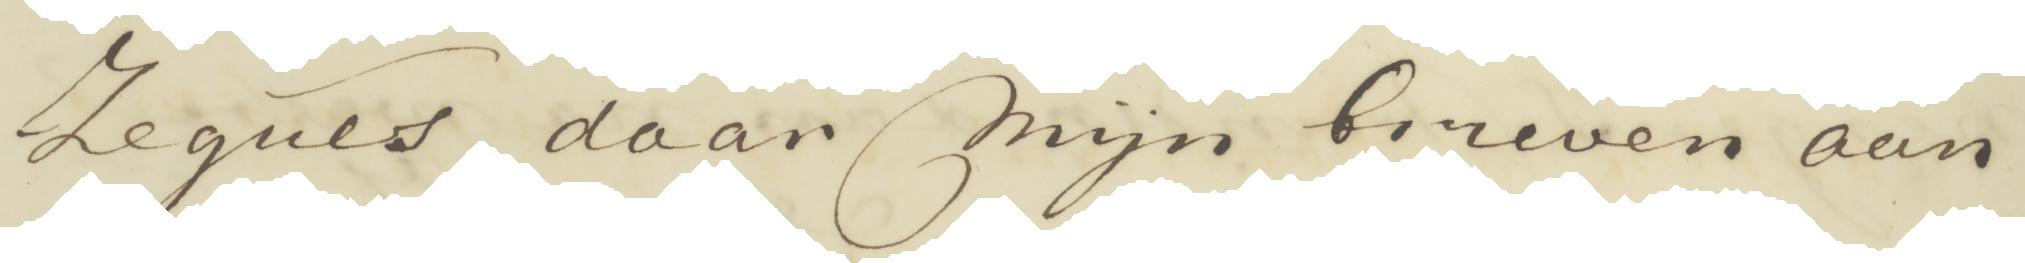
Zeguls daar Mijn brieven aan
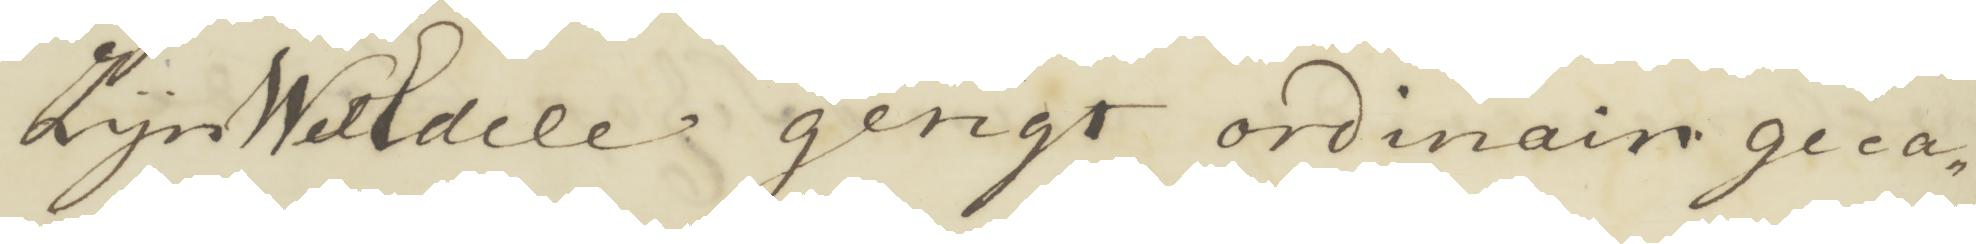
zijn WelEdele gerigt ordinair geca„
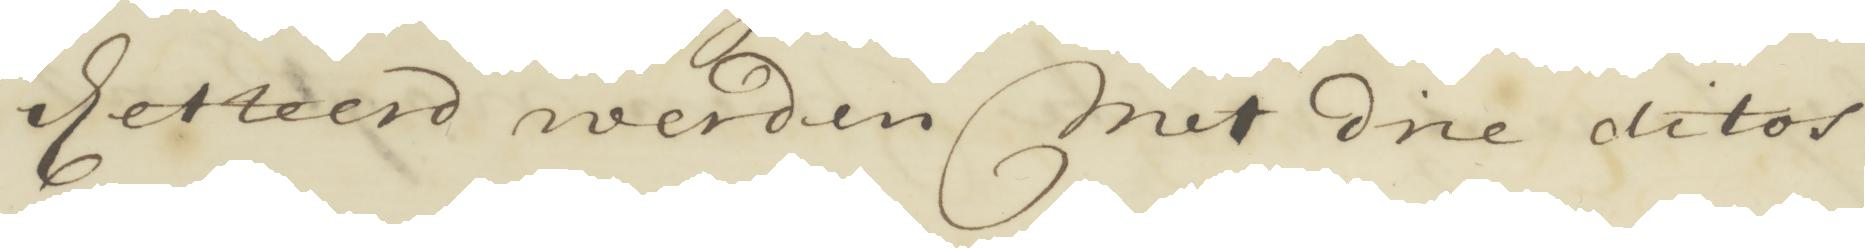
chetteerd werden met drie ditos
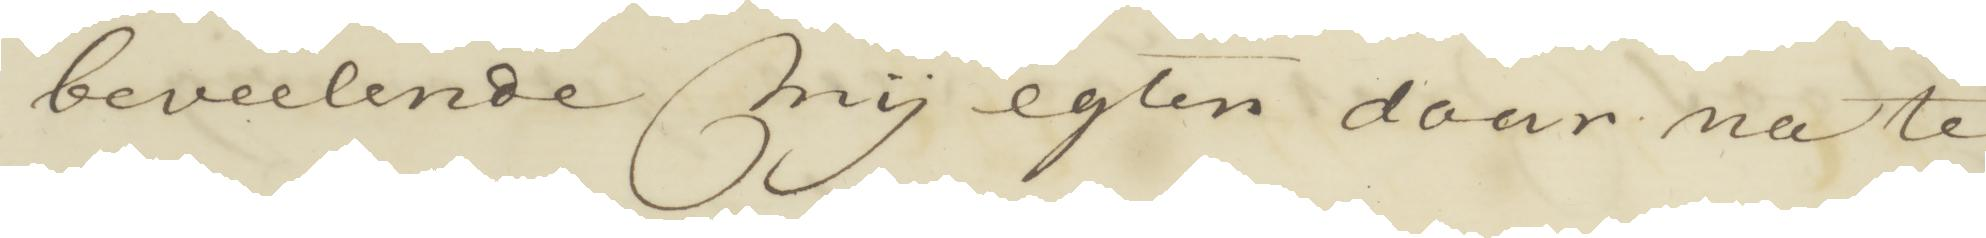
beveelende Mij egter daar na te
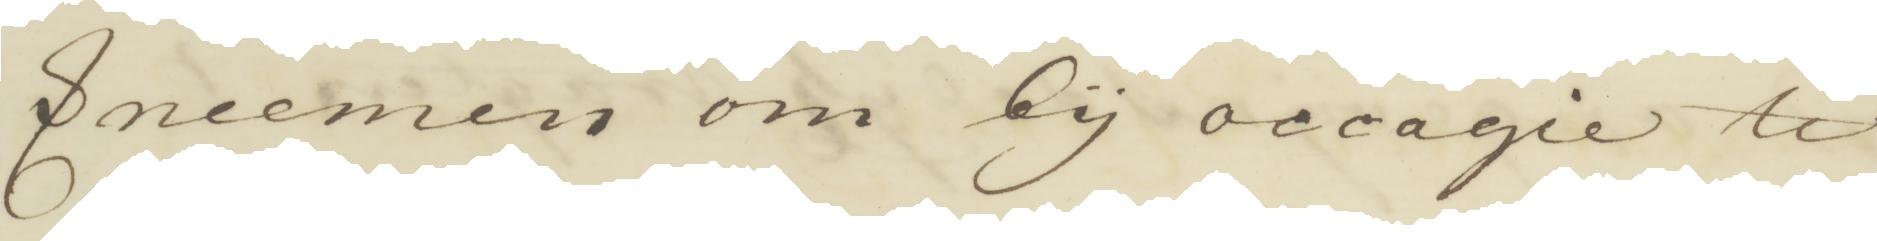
verneemen om bij occagie te
